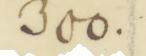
300.
